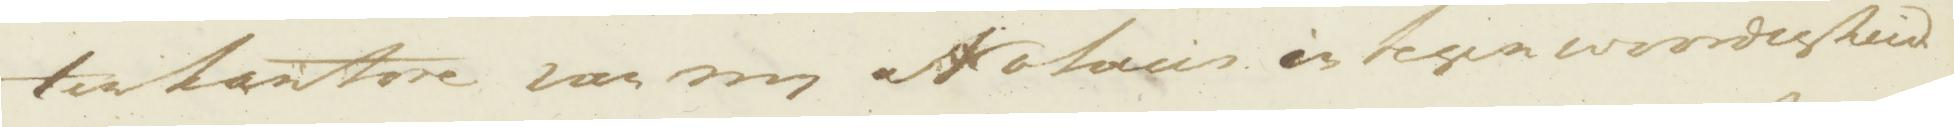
ten kantore van my Notaris in tegenwoordigheid
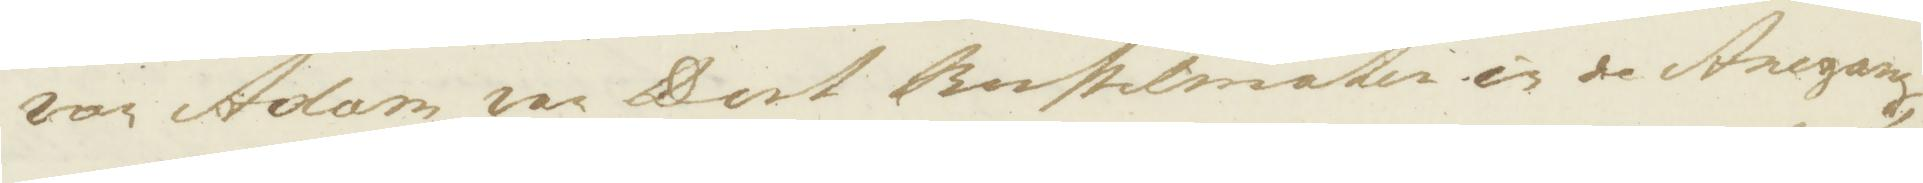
van Adam van Dort Borstelmaker in de Anegang,
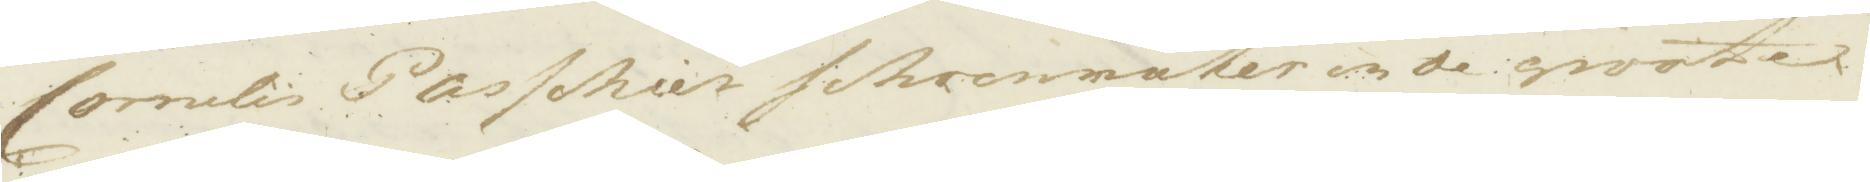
Cornelis Passchier schoenmaker in de groote
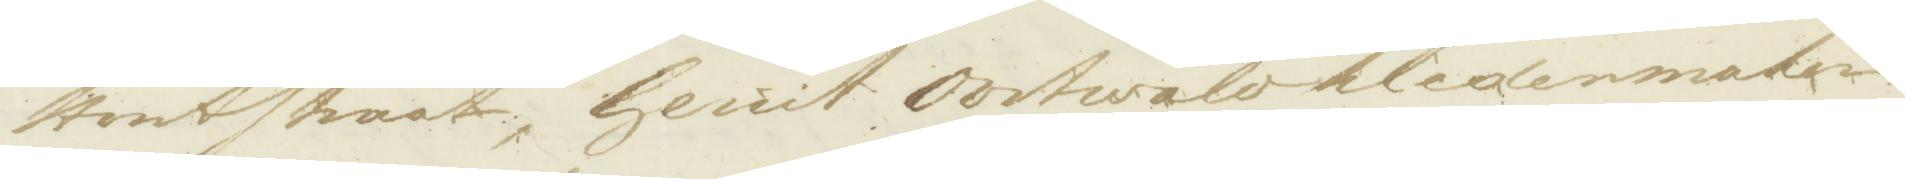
Houtstraat, Gerrit Oostwald kledermaker
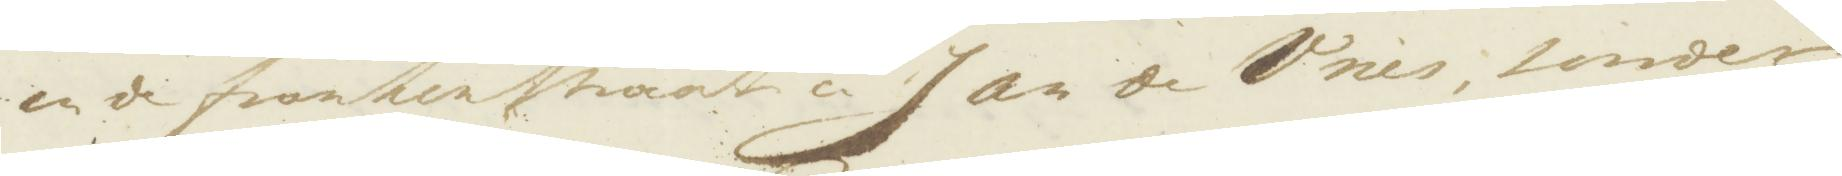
in de frankenstraat en Jan de Vries, zonder
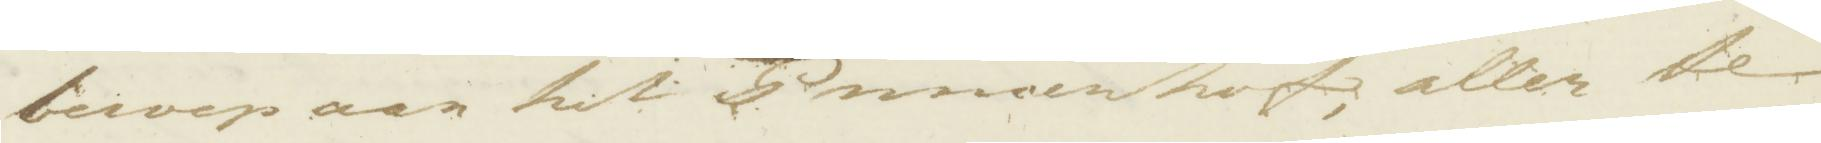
beroep aan het Princenhof, aller te
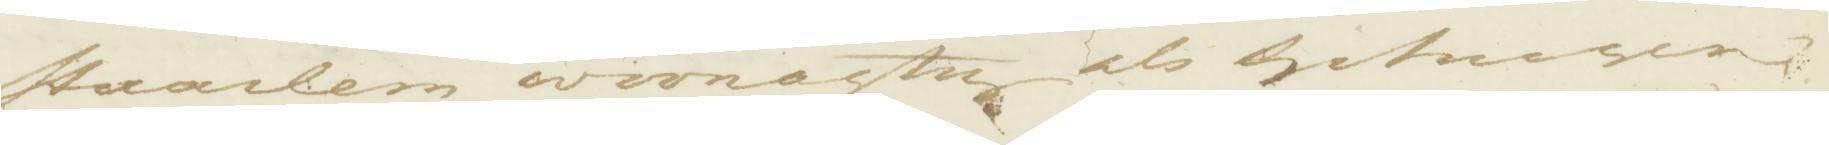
Haarlem woonagtig als Getuigen
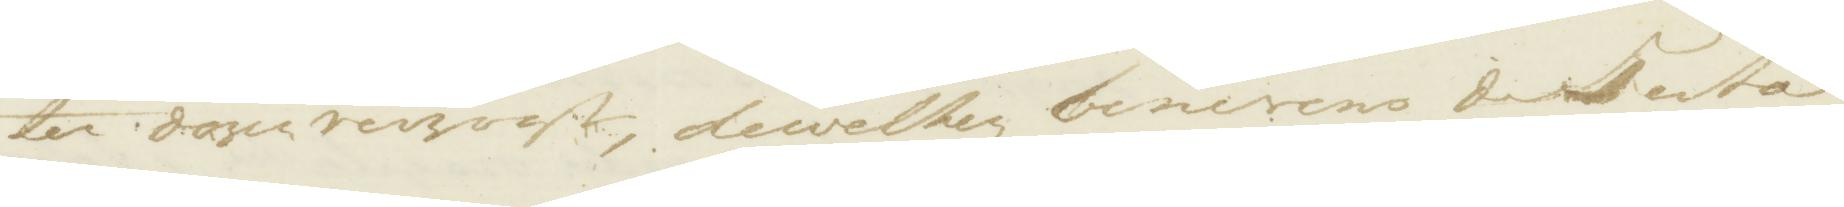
ten dezen verzogt, dewelken benevens de Testa,
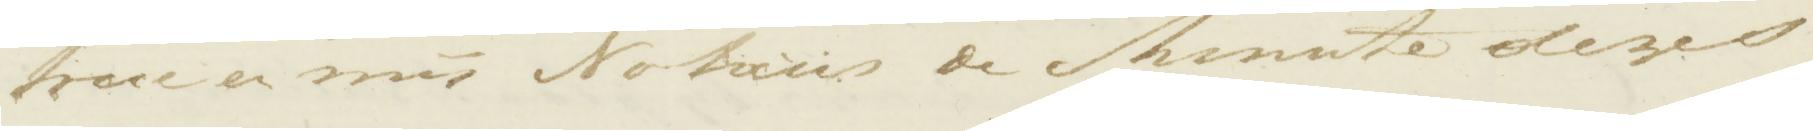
trice en mij Notaris de Minute dezes
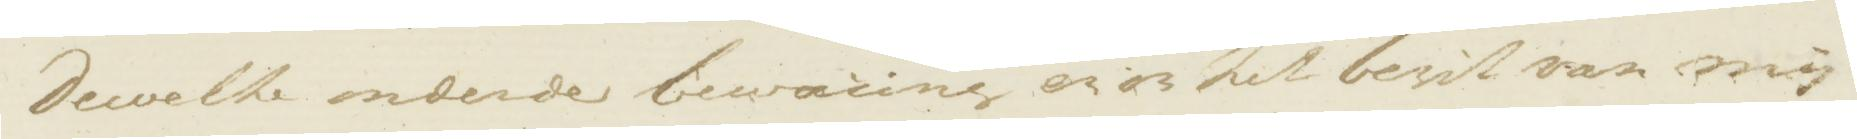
dewelke onder de bewaring en in het bezit van mij
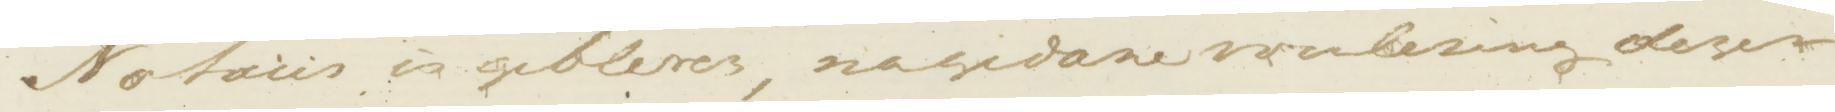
Notaris in gebleven, na gedane voorlezing dezer
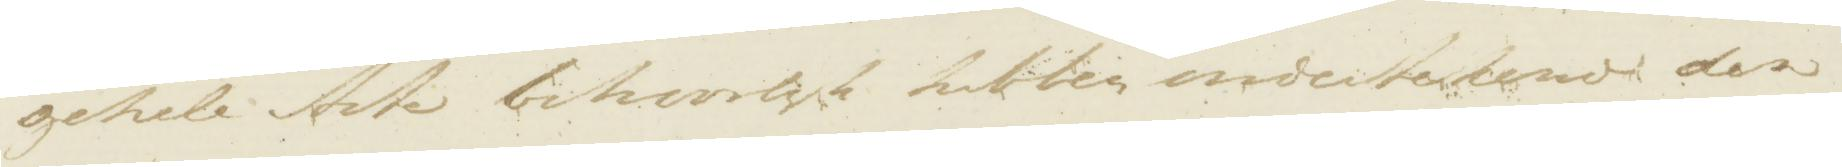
gehele Acte behoorlyk hebben ondertekend den
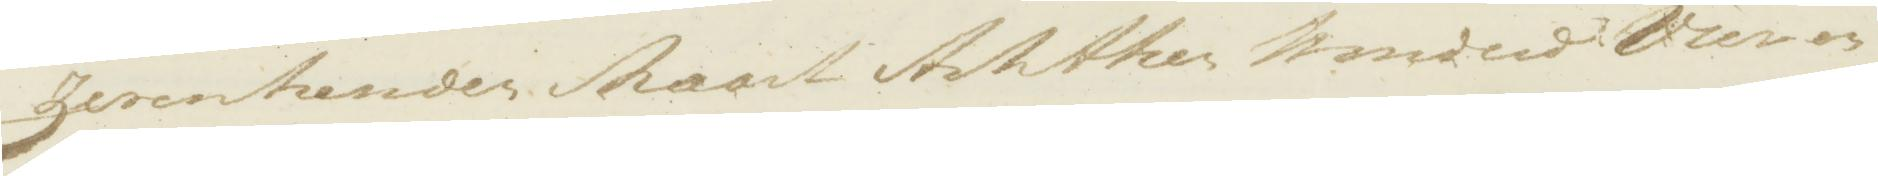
Zeventienden Maart Achttien Honderd Vier en
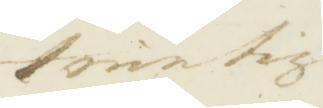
twintig.
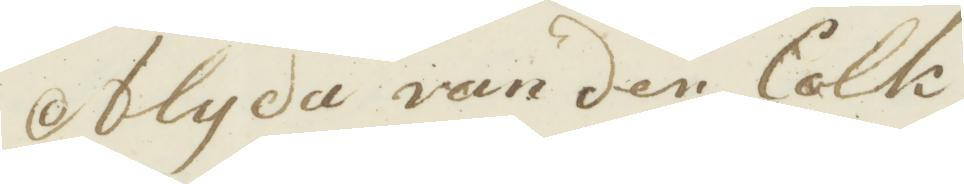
Alyda van den Colk
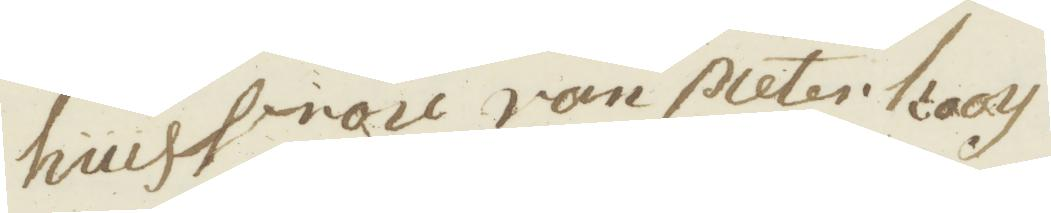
huisvrouw van pieter kooy
